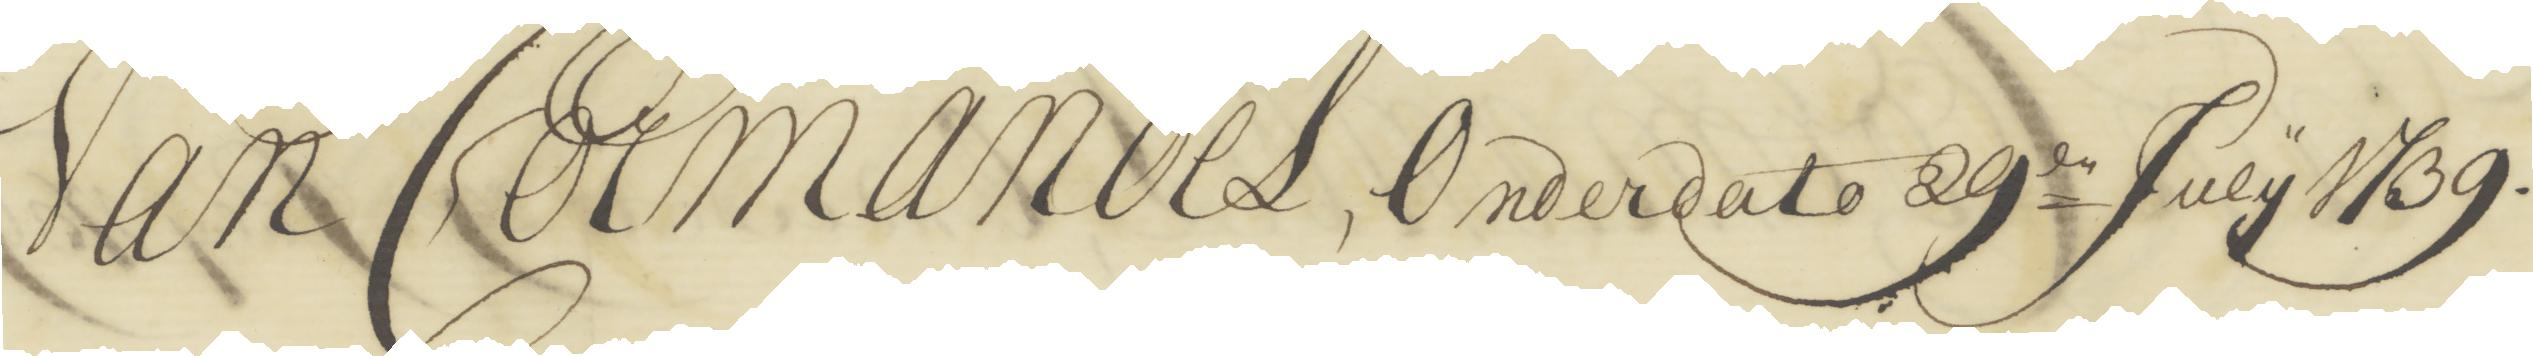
Van Cormandel, Onderdato 29=en Julij 1739
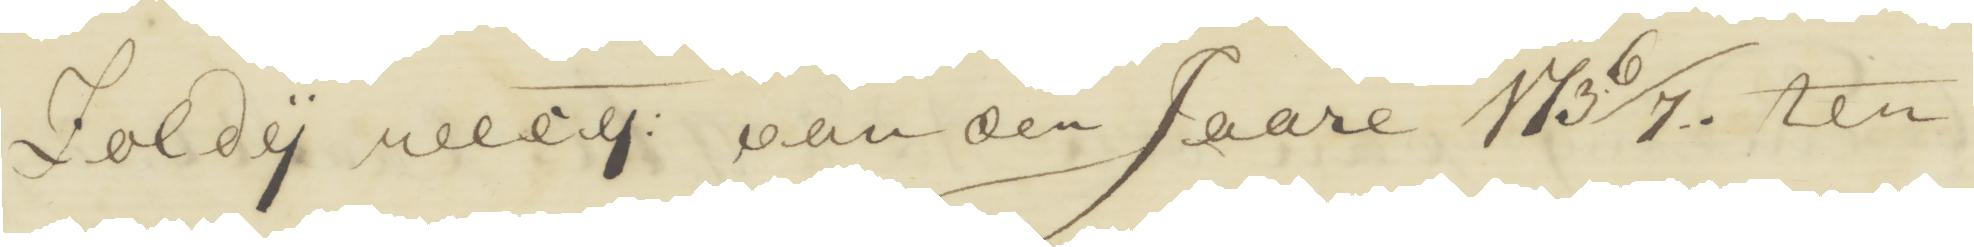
zoldij reecq: van den Jaare 1736/7. ten
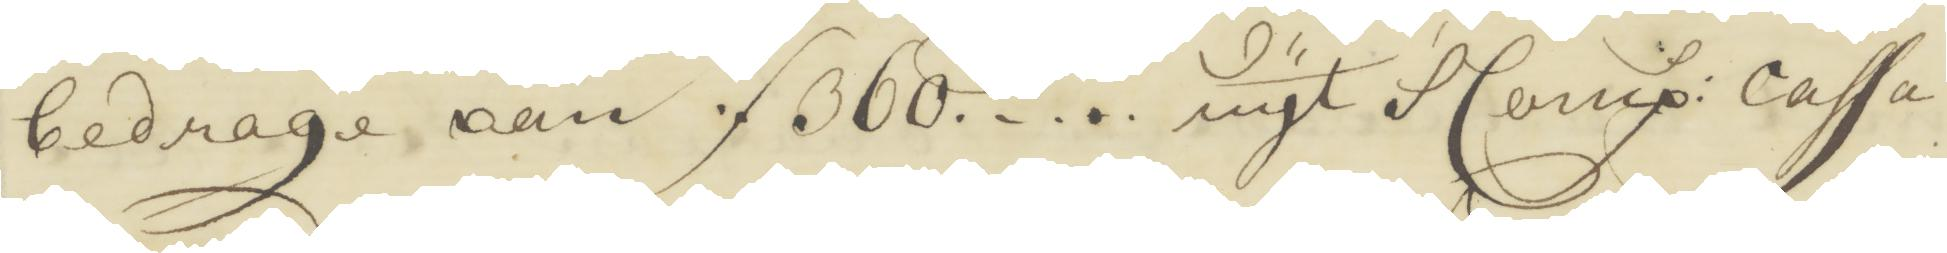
bedrage van ƒ 360. —. —. uijt ’s Comp: Cassa
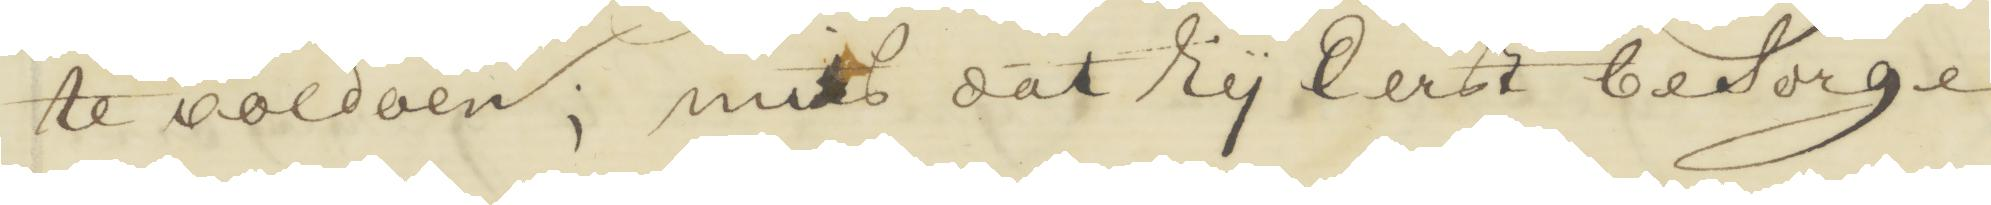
te voldoen; mits dat hij Eerst besorge
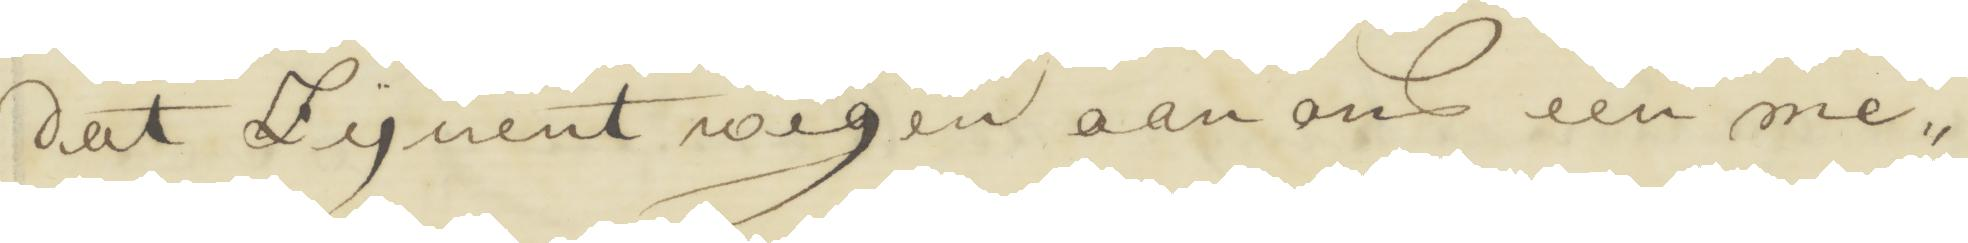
dat zijnent wegen aan ons een me„
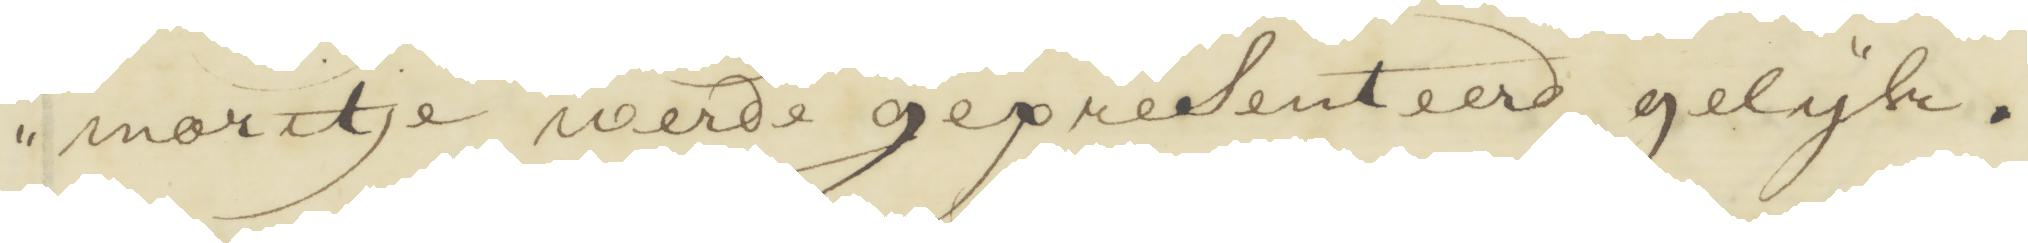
„moritje werde gepresenteerd, gelijk
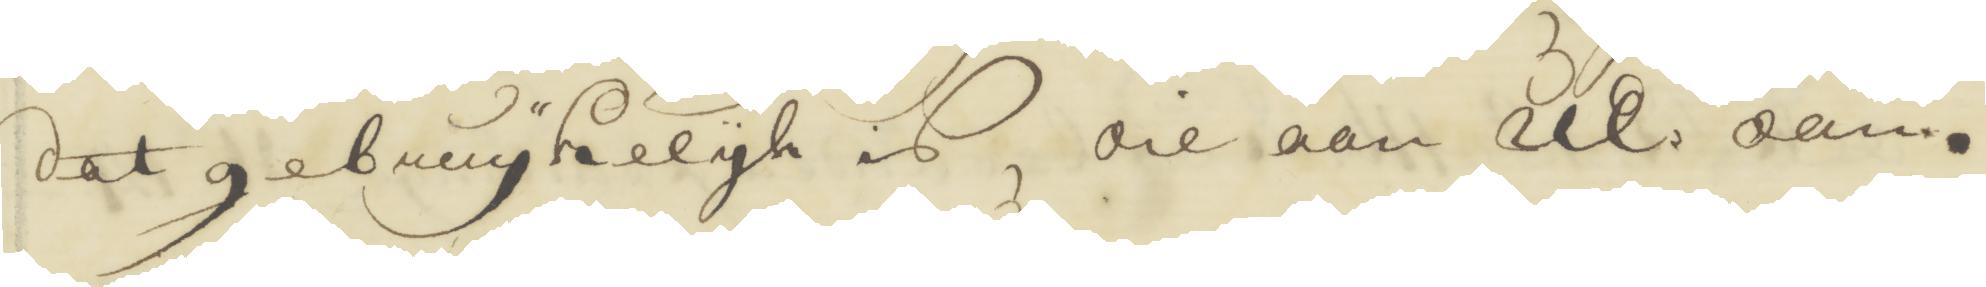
dat gebruijkelijk is, die aan UE: aan
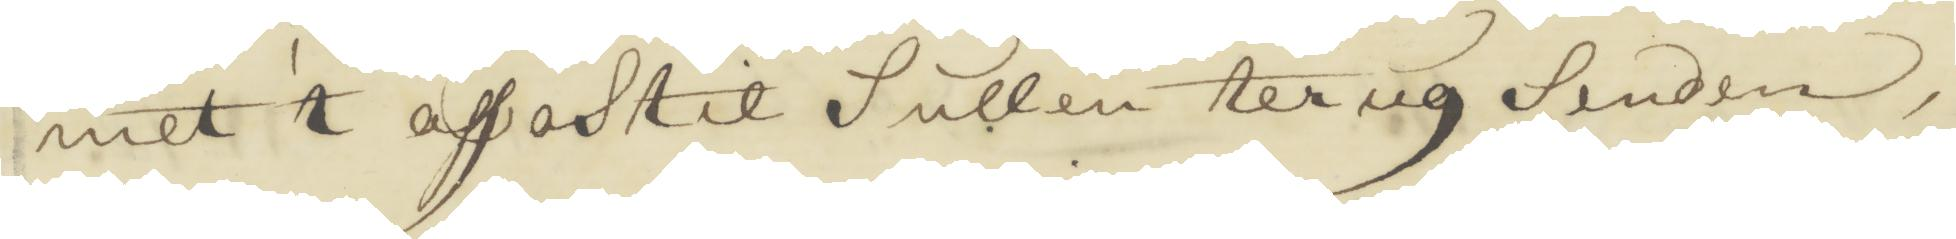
met ’t appostie sullen terug senden,
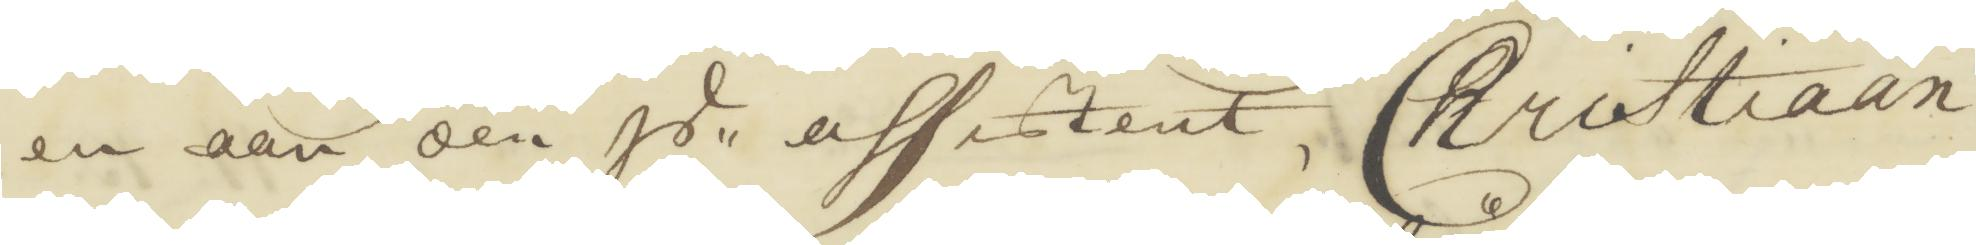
en aan den p„l assistent, Christiaan
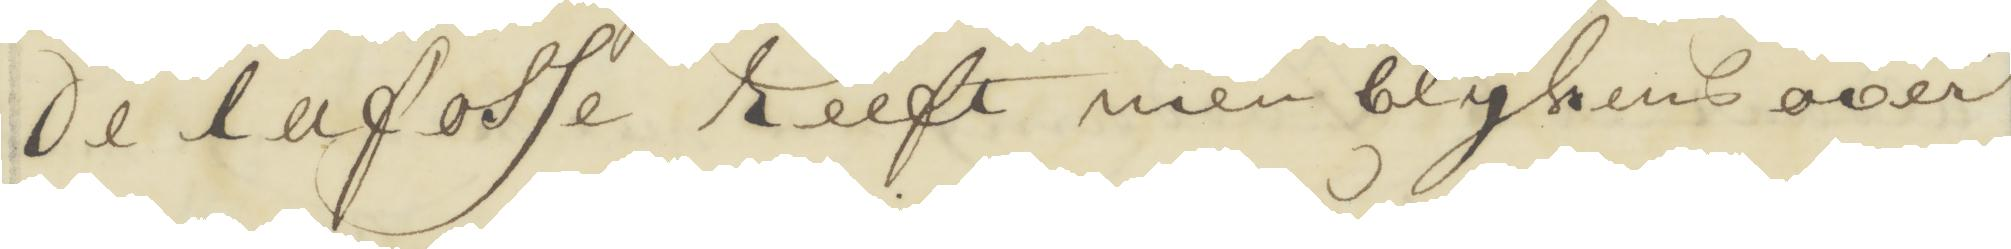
de lafosse heeft men blijkens over
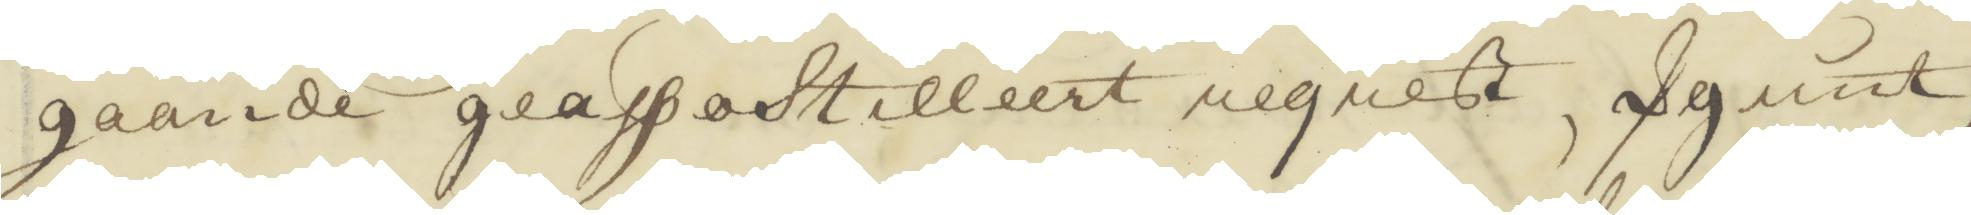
gaande geappostilleert request, vergunt
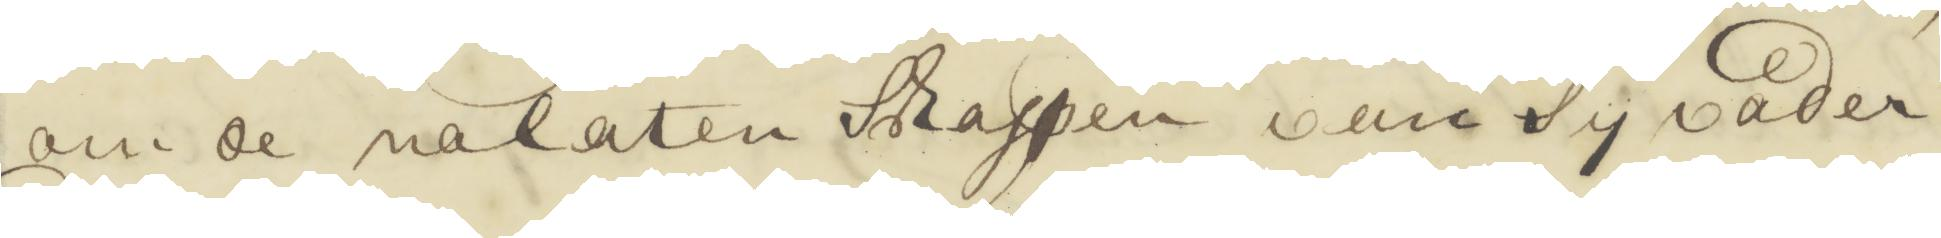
om de nalaten schappen van sij vader
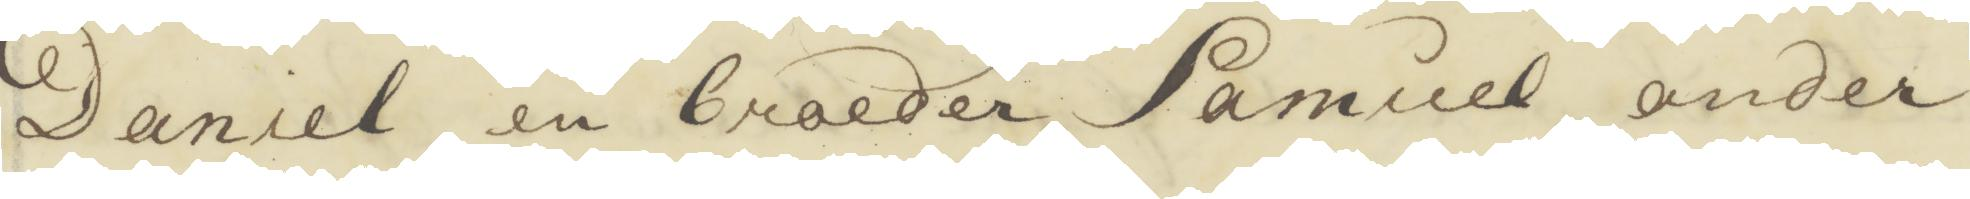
Daniel, en broeder Samuel, onder
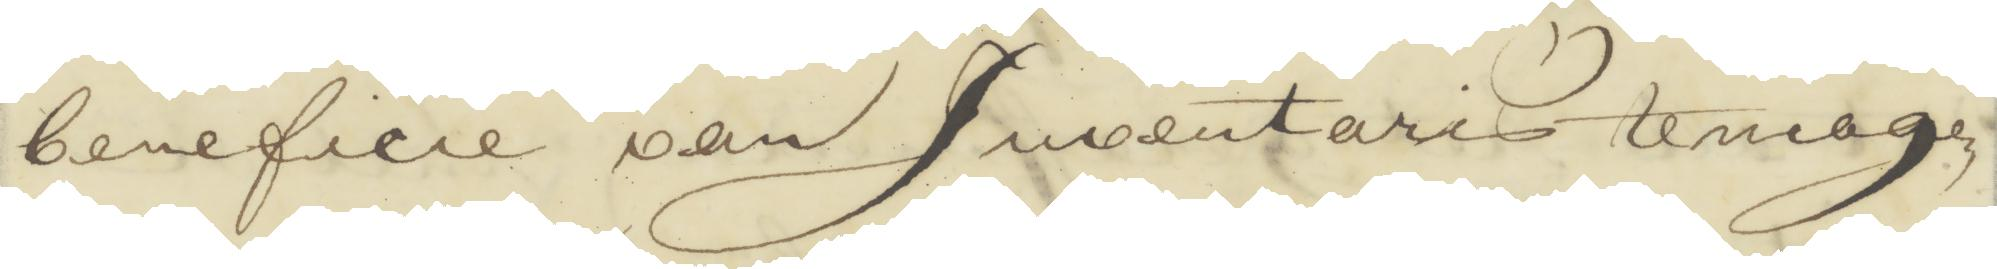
beneficie van Inventaris temogen
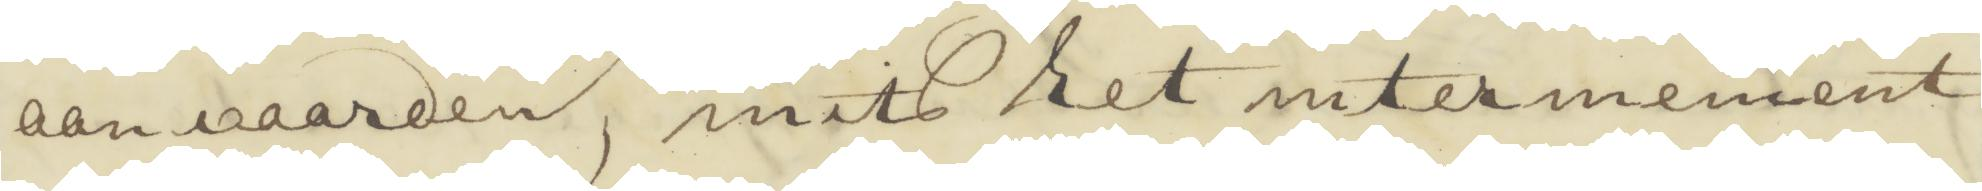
aan vaarden, mits het intermement
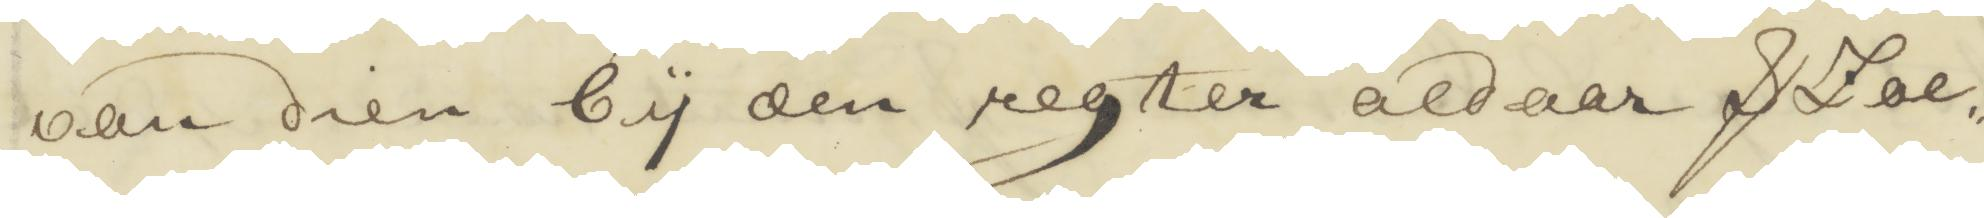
van dien bij den regter aldaar verzoe„
